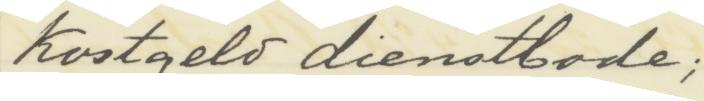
Kostgeld dienstbode;
